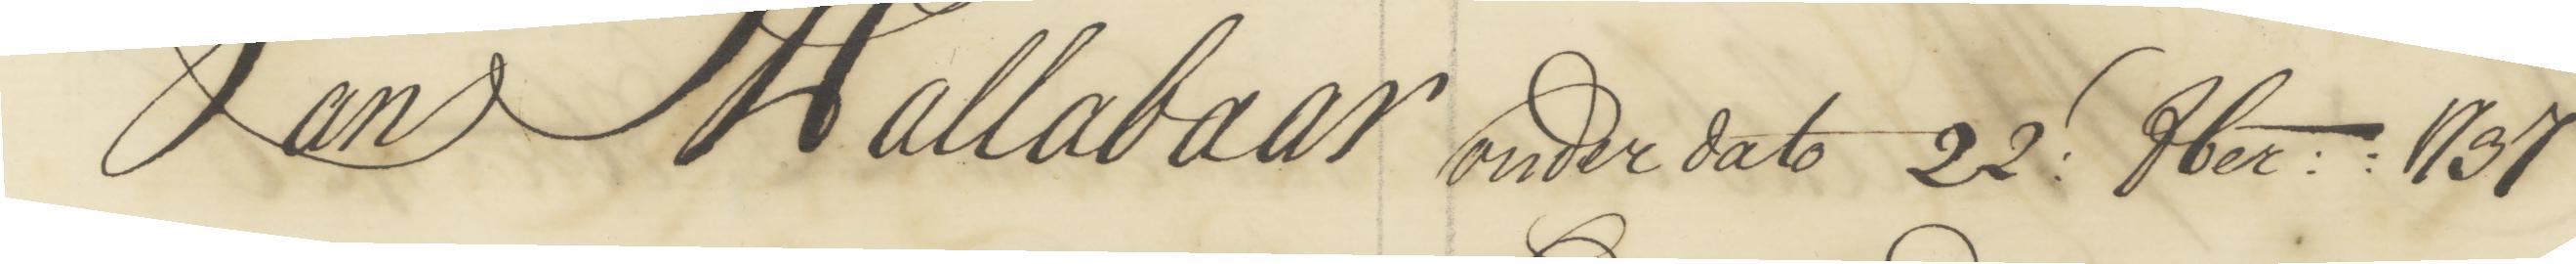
Van Mallabaar onder dato 22:' Iber: 1737
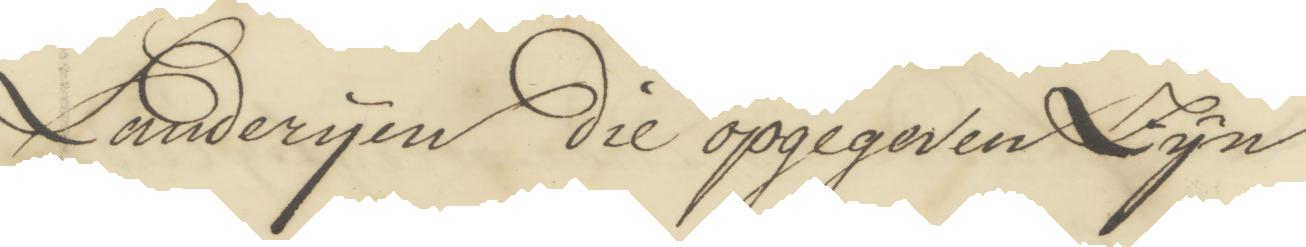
Landerijen die opgegeven zijn
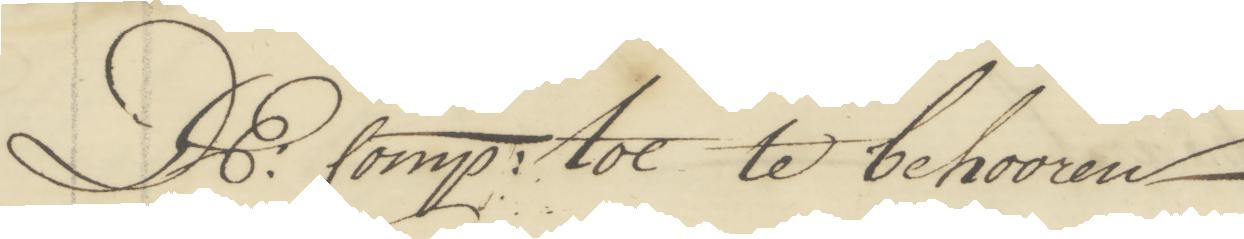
DE: Comp: toe te behooren
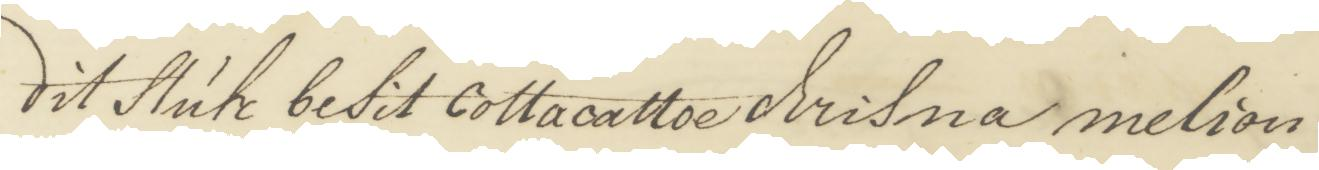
dit stuk besit cottacattoe chrisna melion
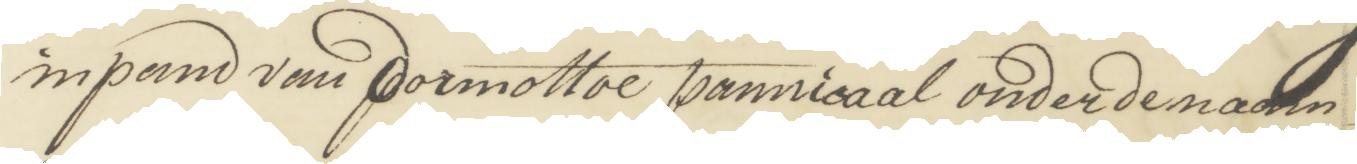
inpand van dormottoe pannicaal onder de naam
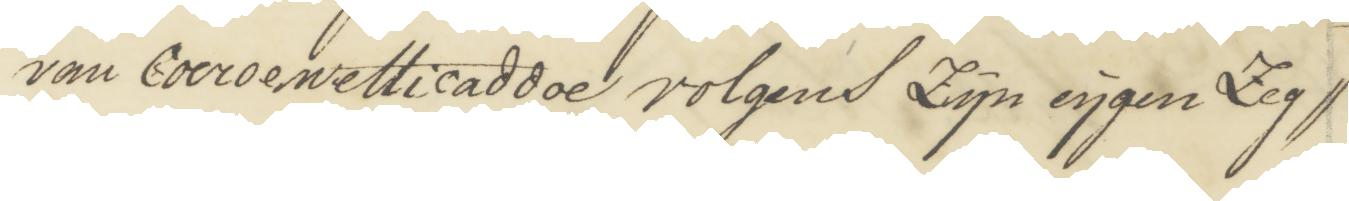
van Coeroewetticaddoe volgens zijn eijgen zeg„
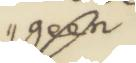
„geen
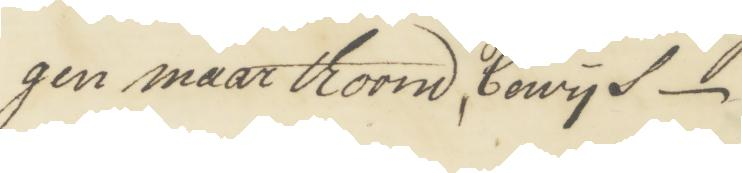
gen maar thoond„ bewijs—
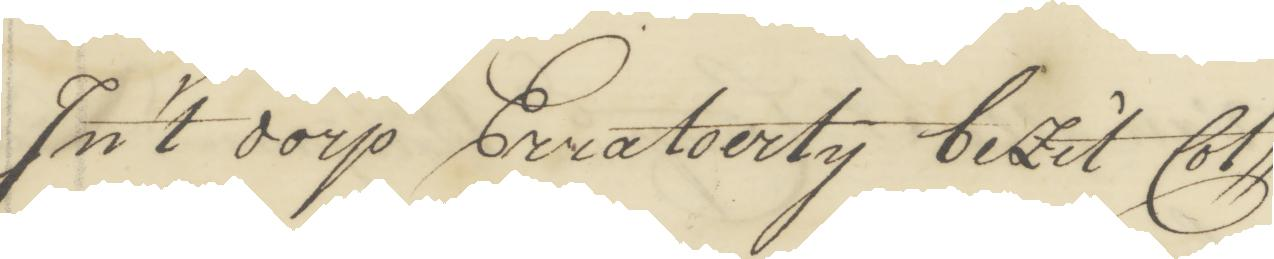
Jn ’t dorp Erratoertij bezit Cot
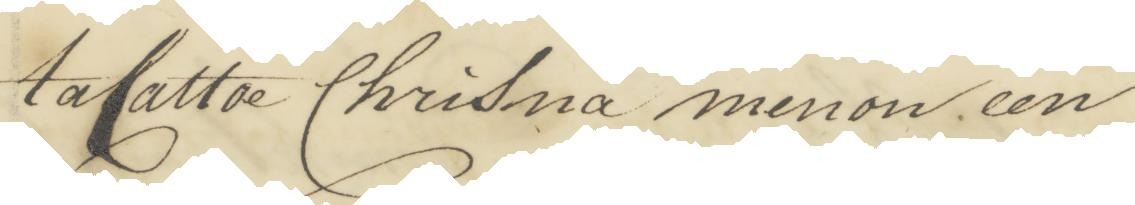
ta Cattoe Chrisna menon een
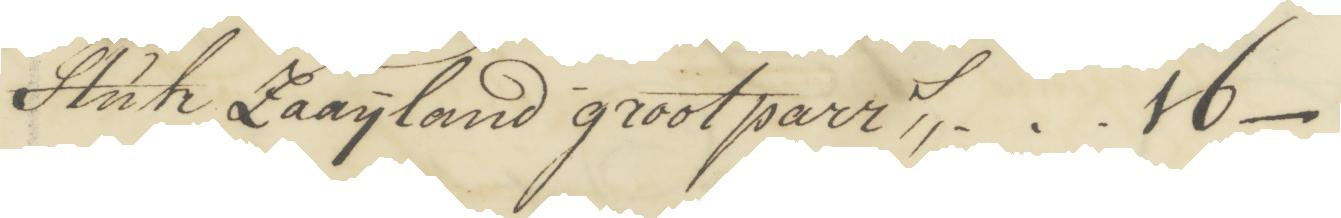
stuk zaaijland groot parr„s- . . 16 —
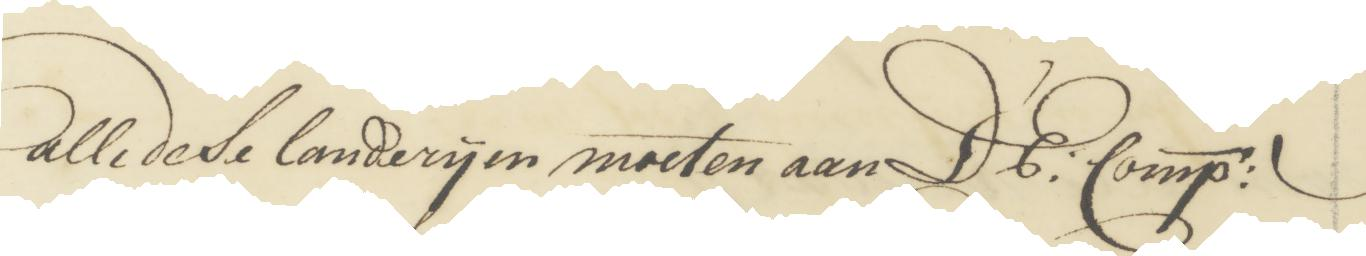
alle dese landerijen moeten aan D' E: Comp:
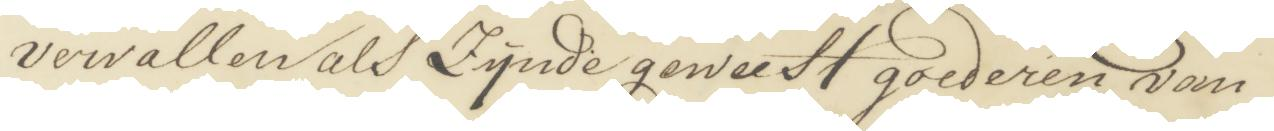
vervallen als zijnde geweest goederen van
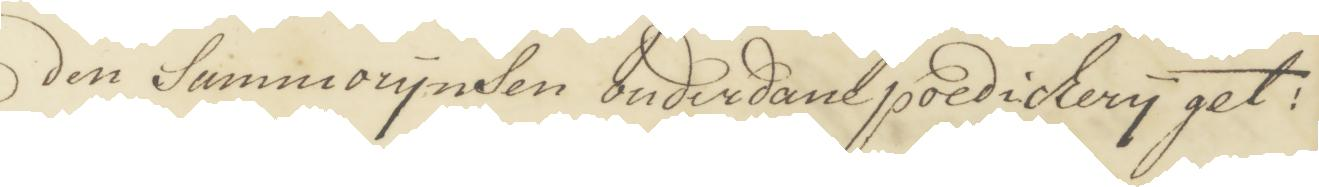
den summorijnsen onderdane poedicherij get:
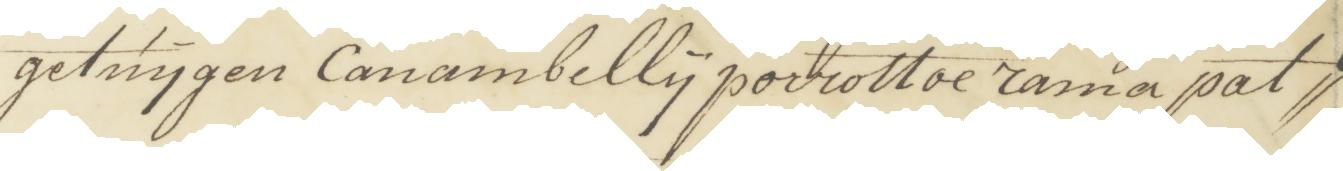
getuijgen Canambellij porrottoe rama pat„
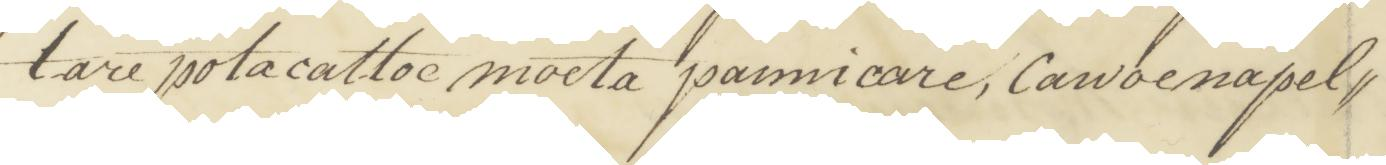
tare potacattoe moeta pannicare, Cawoenapel„
